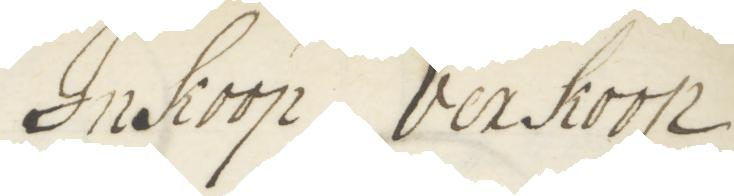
Inkoop verkoop
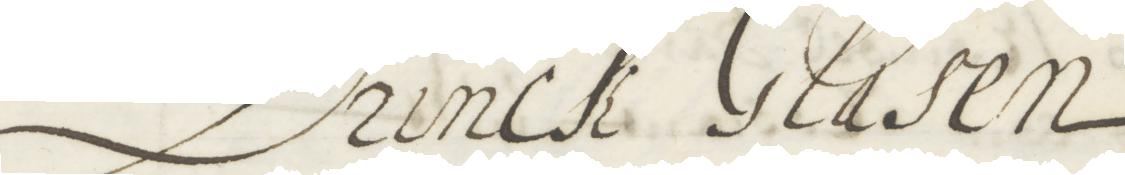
Drinck Glasen
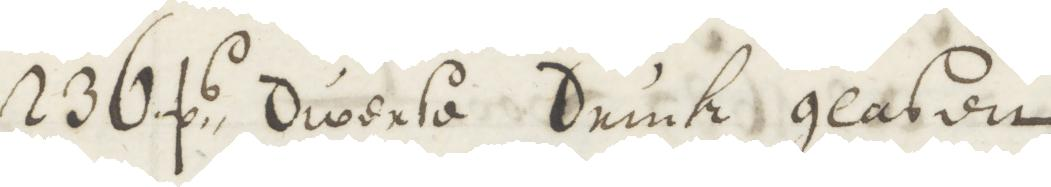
236 p„s diverse drink glasen
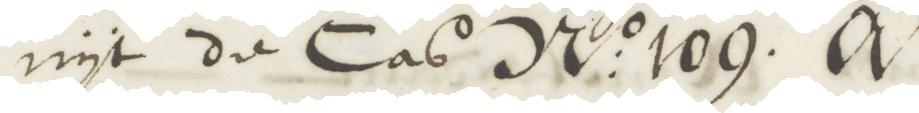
uijt de Cas N:o 109. A
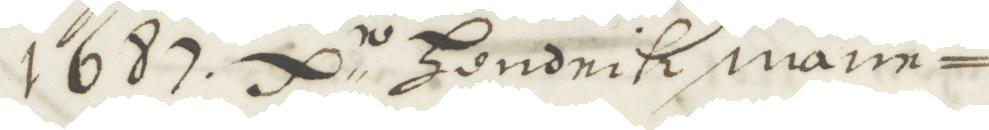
1687. p„r hendrik maur=
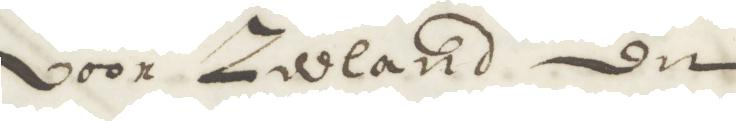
voor Zeeland en
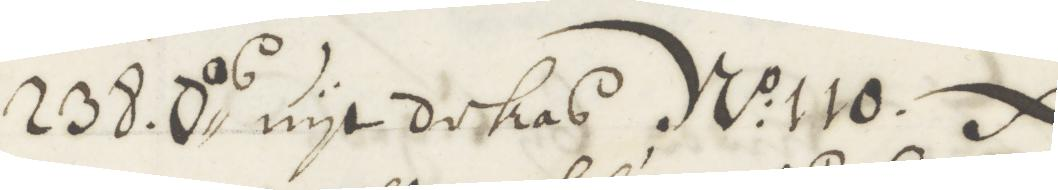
238. d„os uijt dekas N:o 110. p
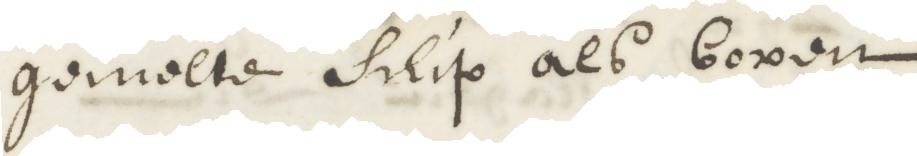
gemelte schip als boven
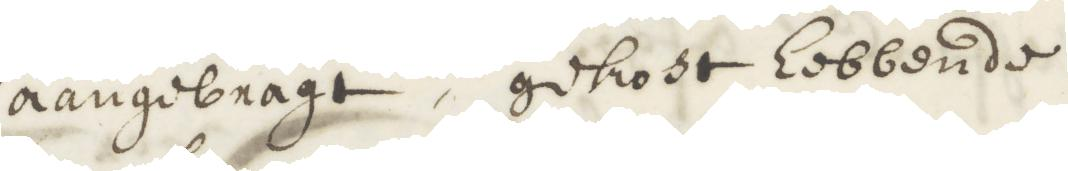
aangebragt, gekost hebbende
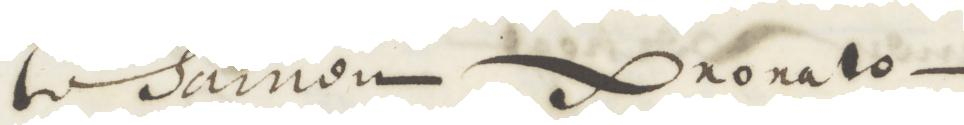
te samen prorato
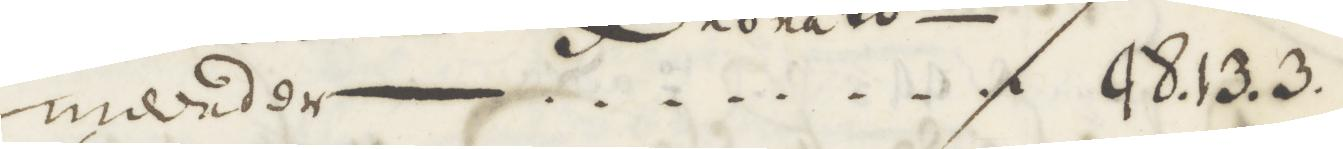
meerder . . . . . . . ƒ 48.13.3.
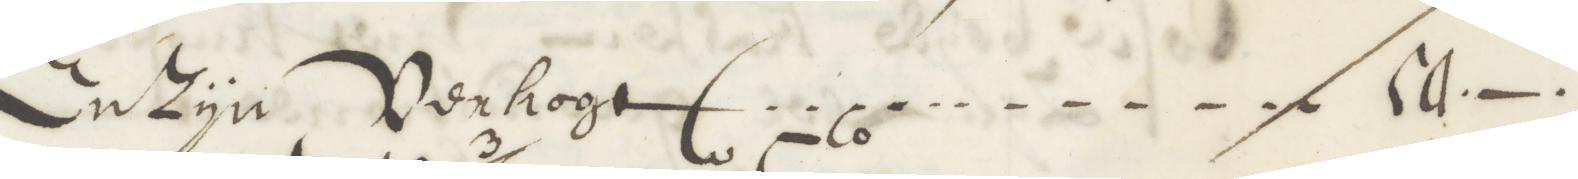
En zijn Verkogt . . . . . . - - - - ƒ 54.-.
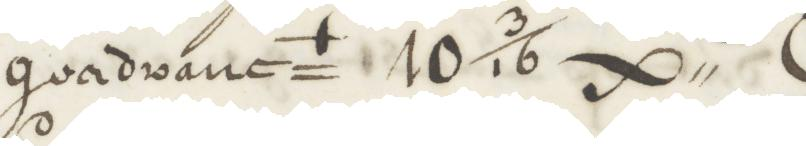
geadvanc=t 10 3/16 p„ C=to
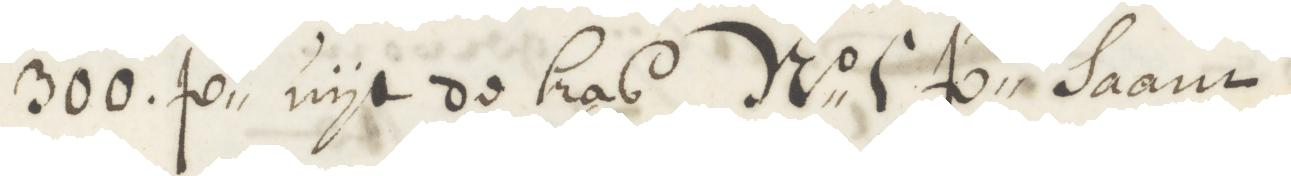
300. p„s uijt de kas N„o 5 p„r saam
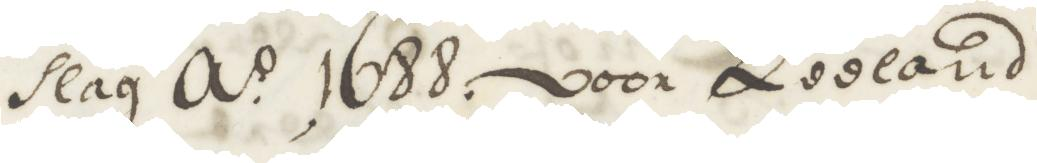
slag A:o 1688. voor Zeeland
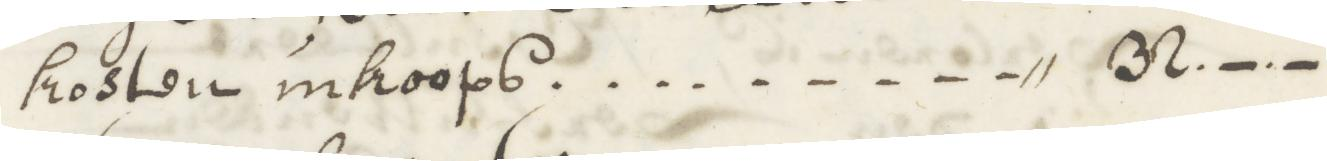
kosten inkoops . . . . . - - - 32. -.-
